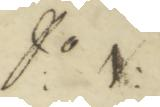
f:o 1:
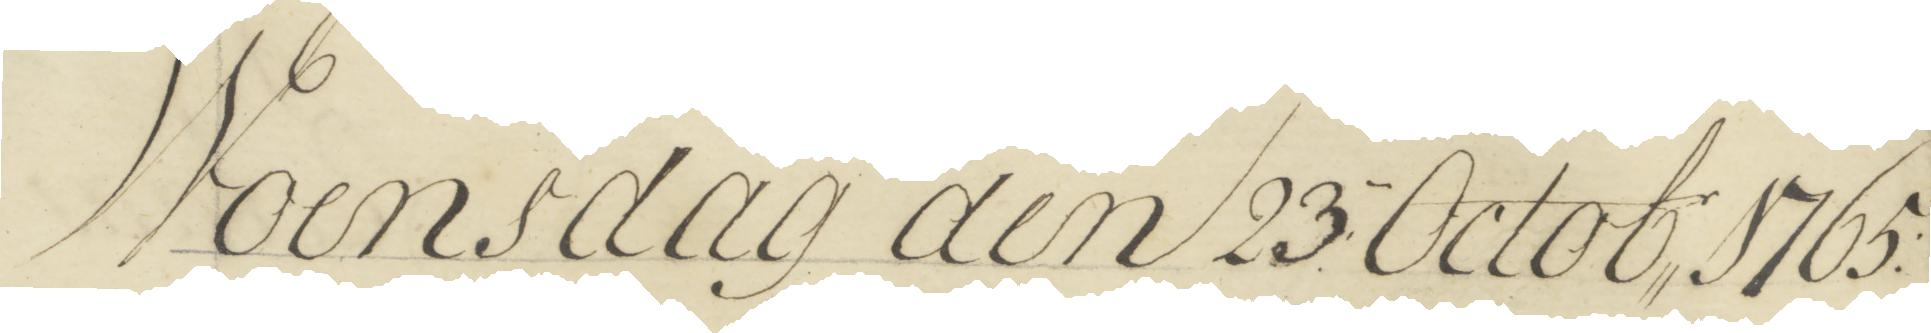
Woensdag den 23: Octob„r 1765:
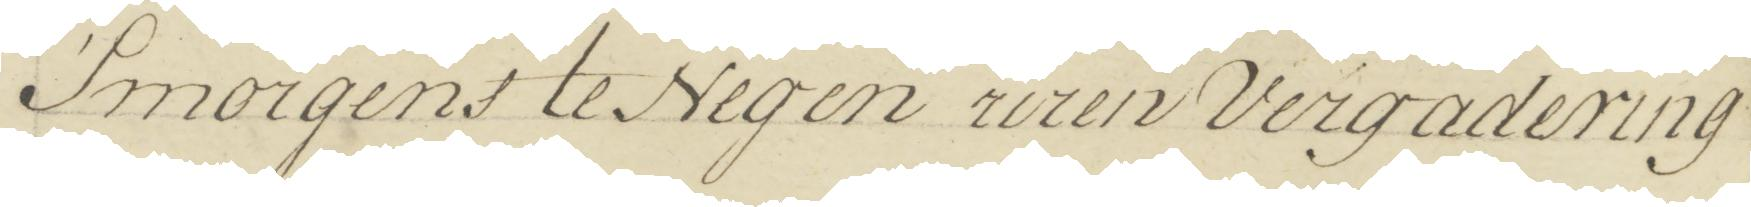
Smorgens te Negen uren vergadering
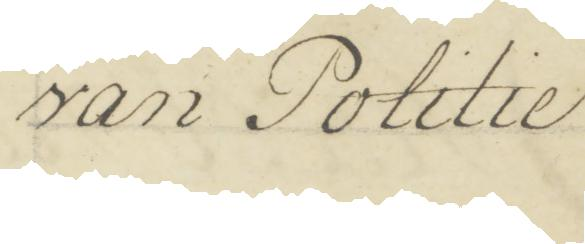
van Politie
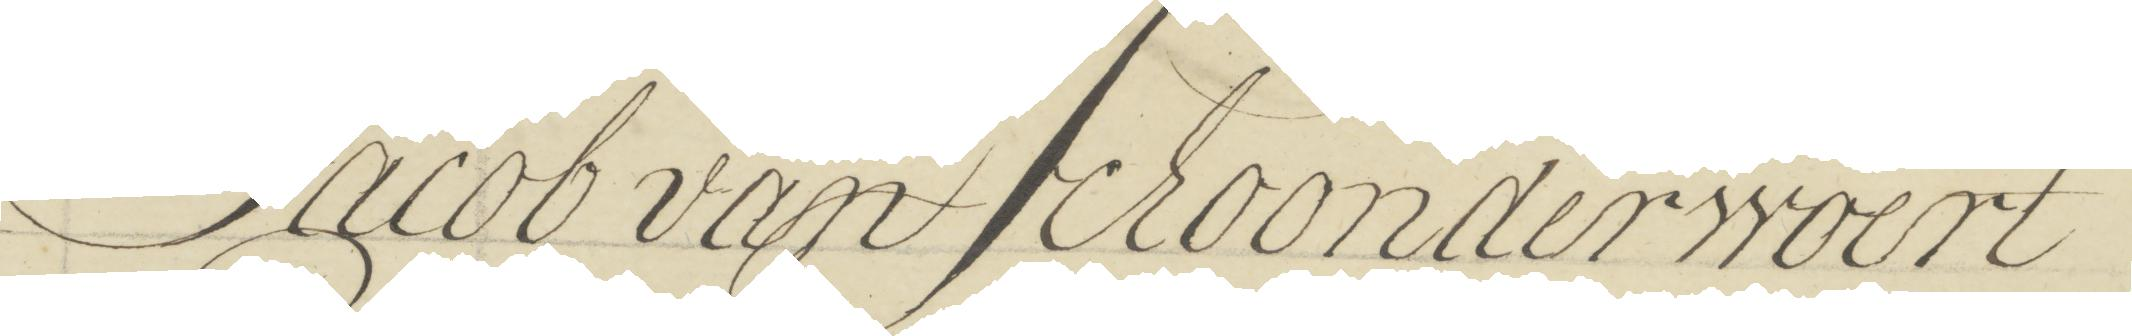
Jacob van Schoonder woert
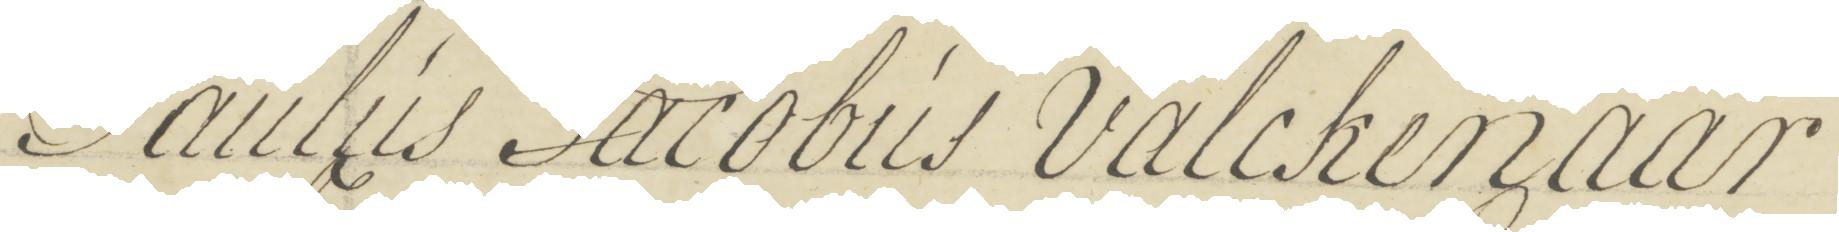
Paulus Jacobus Valckenaar
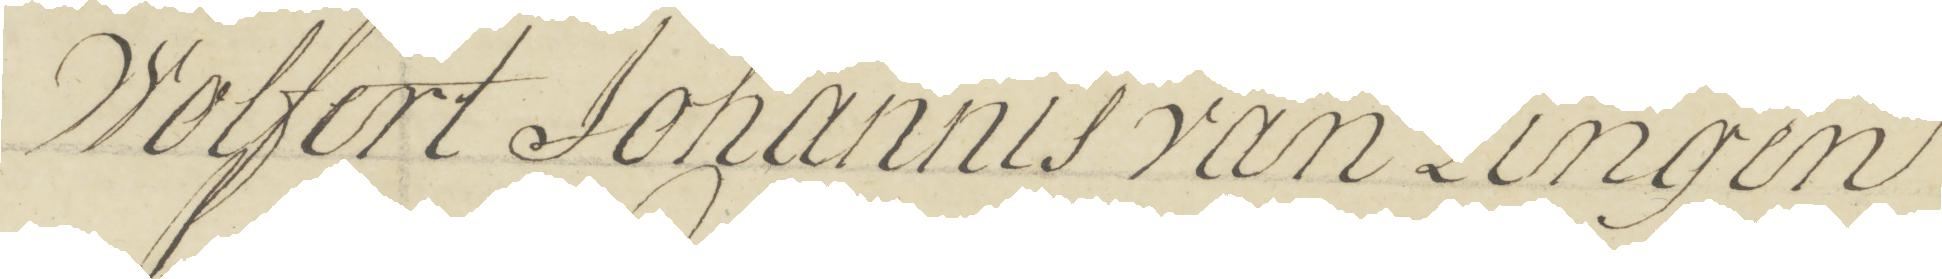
Wolfert Johannis van Lingen
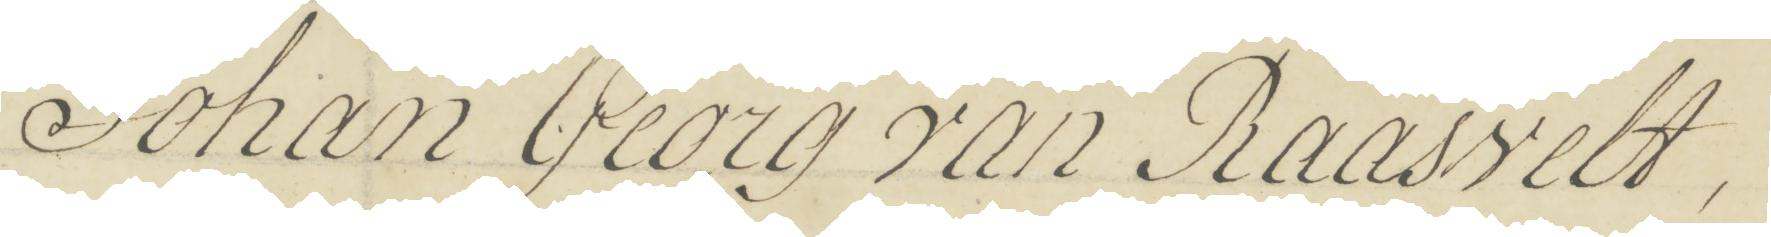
Johan Georg van Raasvelt,
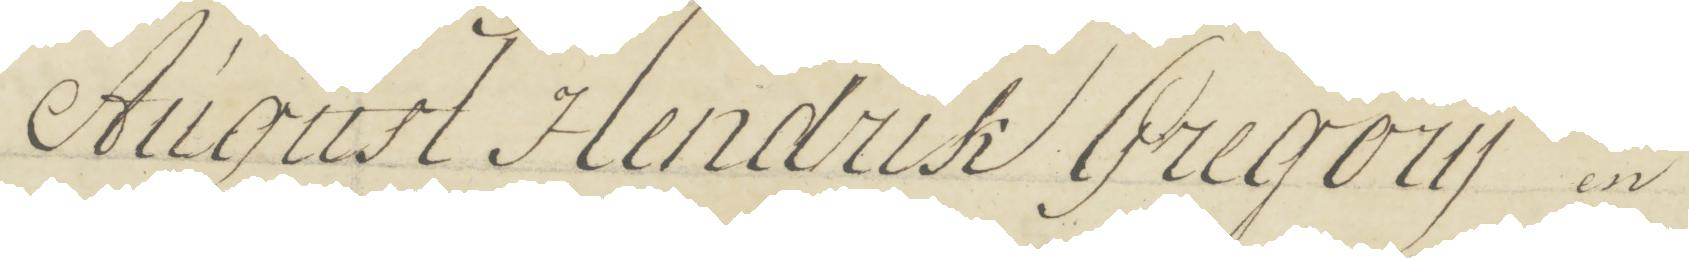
August Hendrik Gregorij en
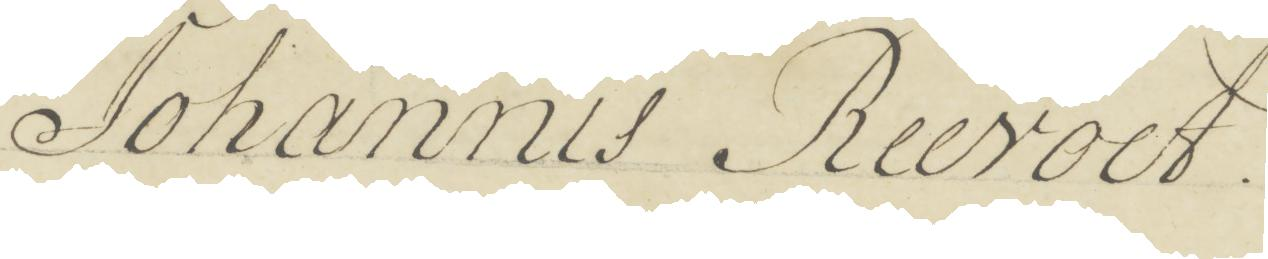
Johannis Reevoet.
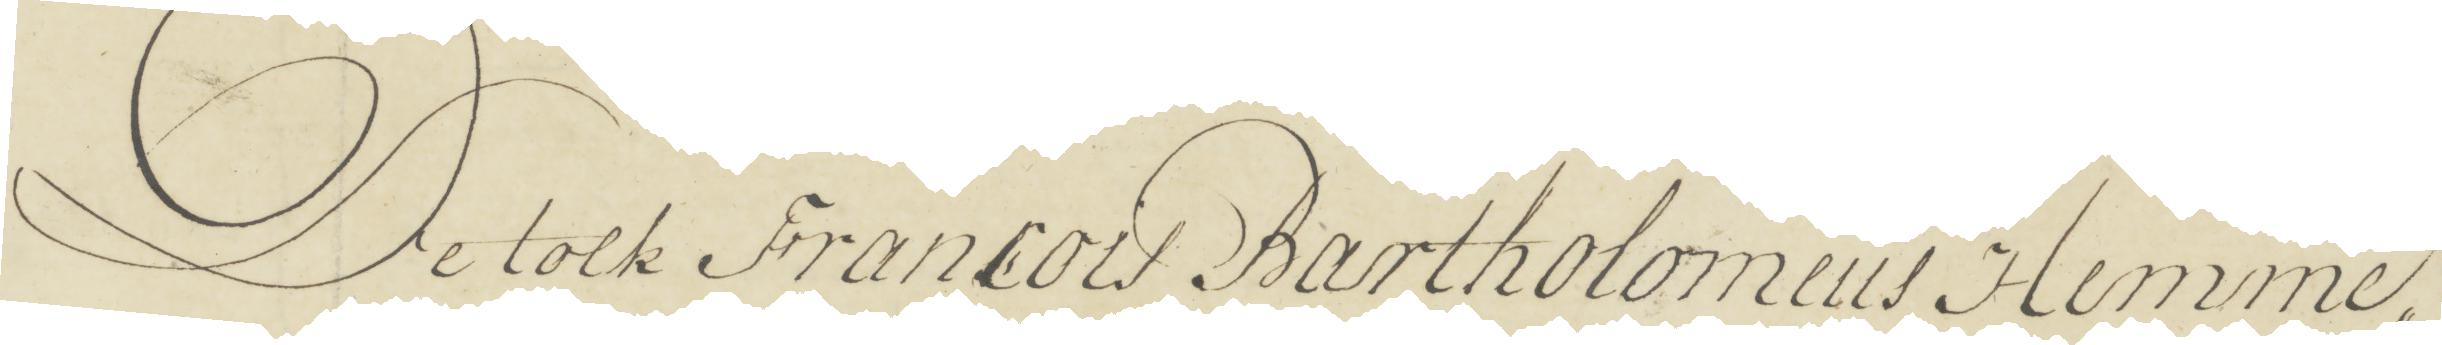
De tolk Francois Bartholomeus Hemme„
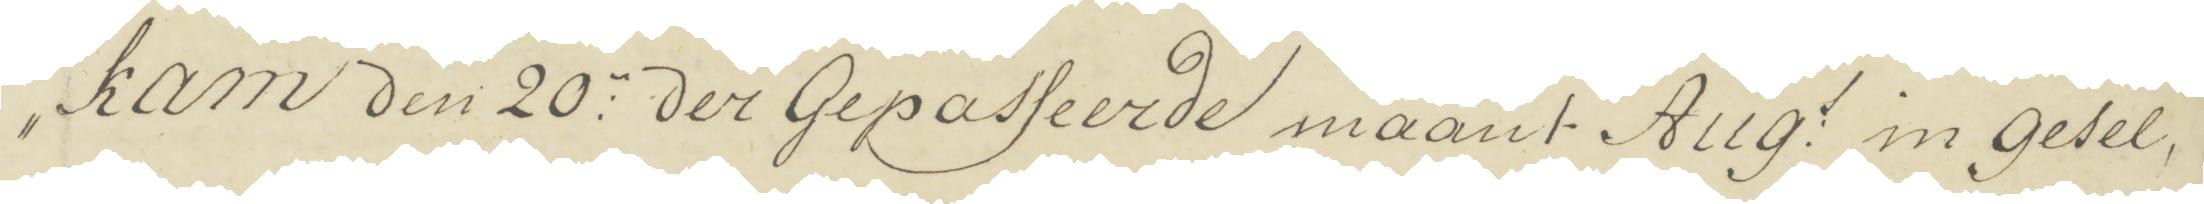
„kam den 20:e der Gepasseerde maant Aug:s in gesel„
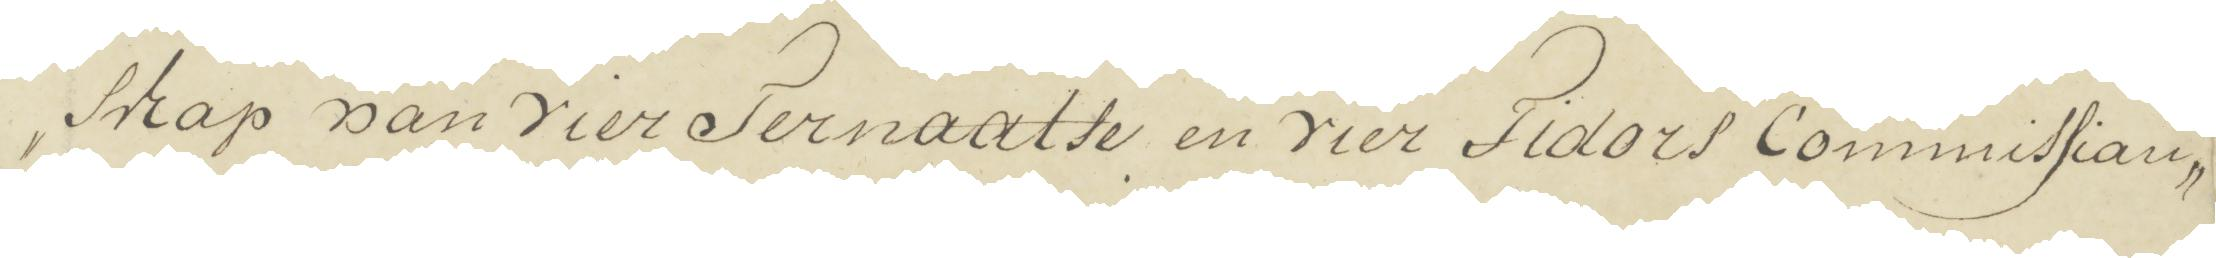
„schap van vier Ternaatse, en vier Tidors Commissian„
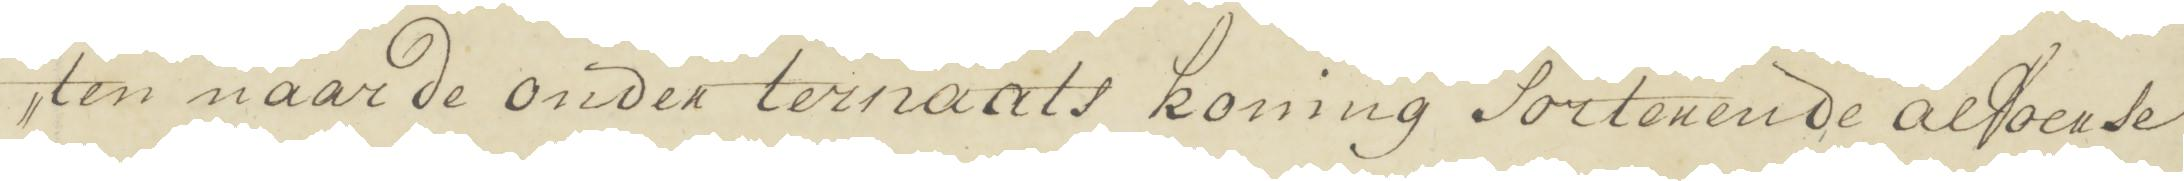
„ten naar de onder ternaats koning sorterende alfoerse
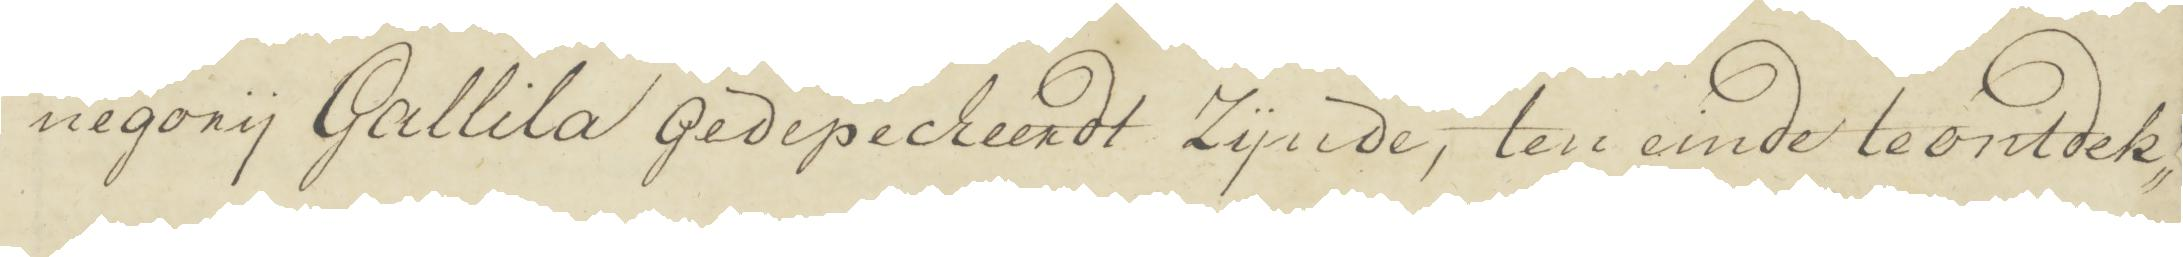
negorij Gallila gedepecheerdt Zijnde, ten einde te ontdek„
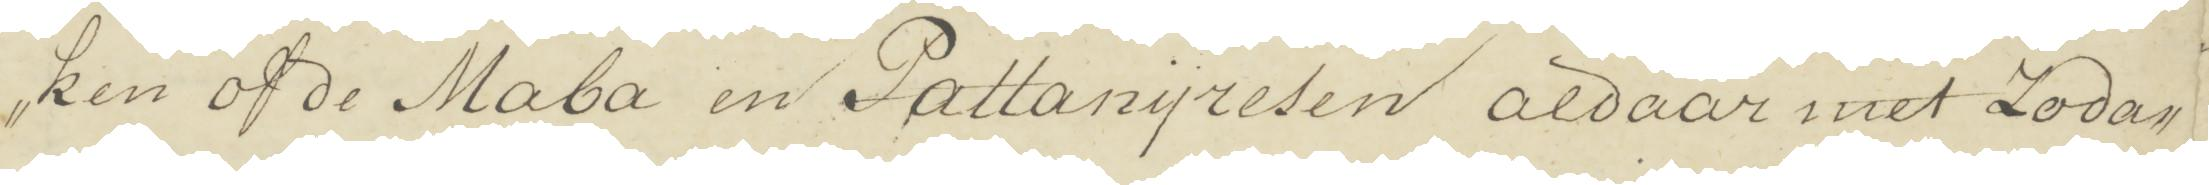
„ken of de Maba en Pattanijresen aldaar met Zoda„
